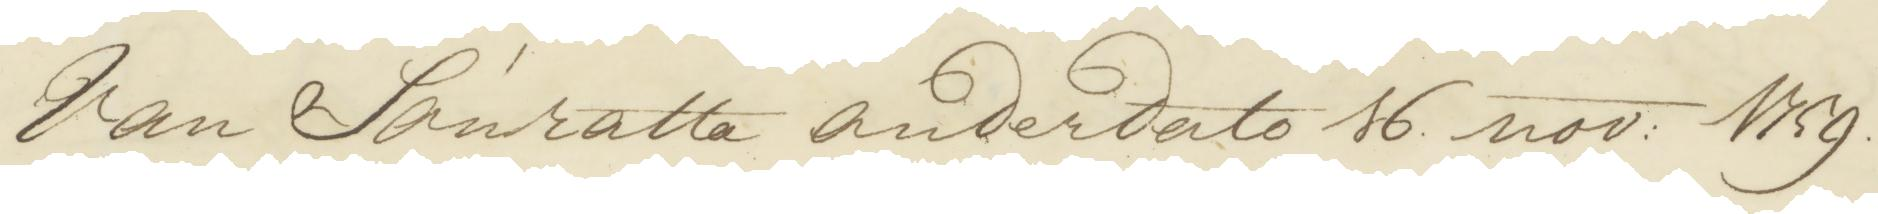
Van Souratta onderdato 16. nov: 1759.
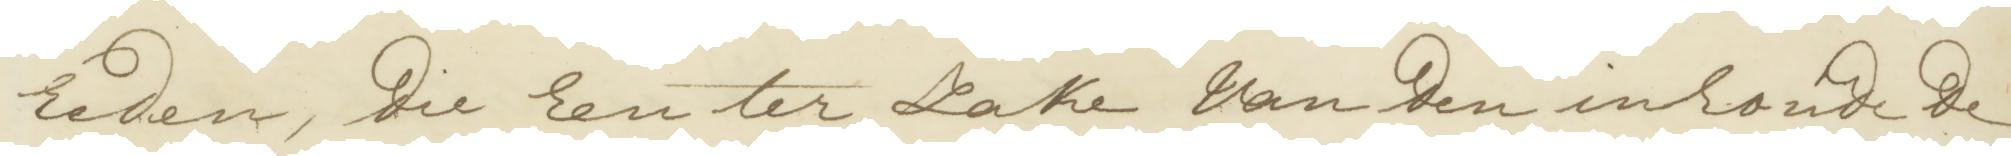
heden, die hen ter zake van den inhoude de
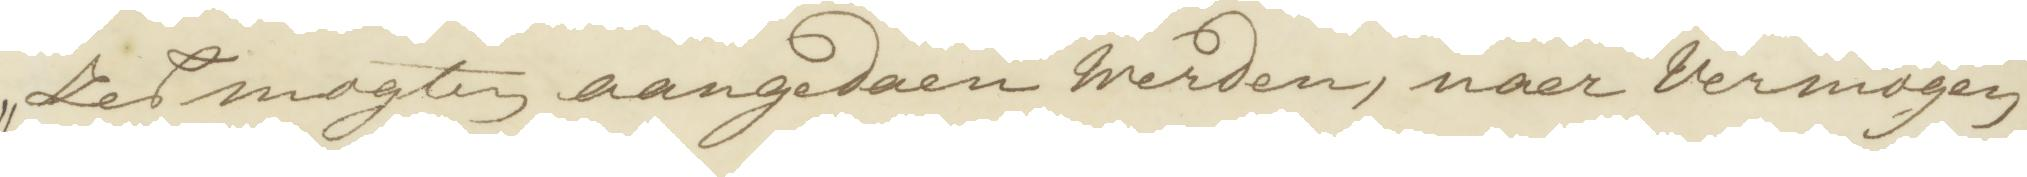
„zes mogten aangedaen werden, naer vermogen
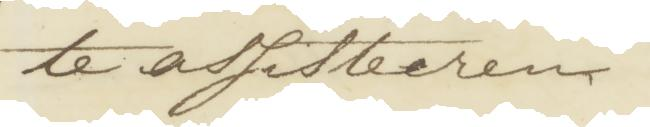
te assisteeren
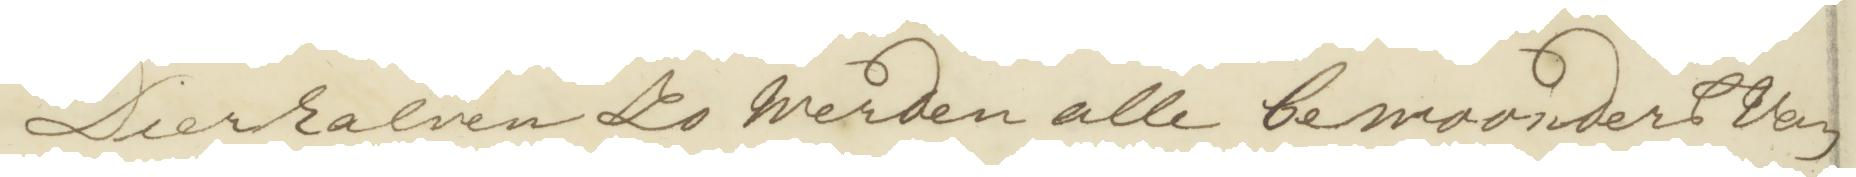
Dierhalven zo werden alle bewoonders van
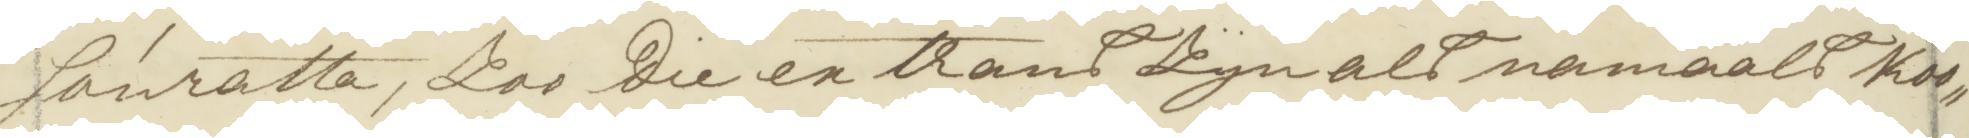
Souratta, zoo die er thans zijn als namaals koo„
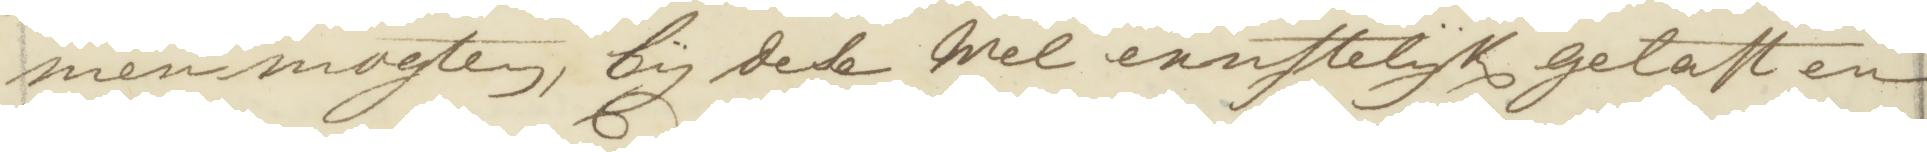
men mogten, bij dese wel ernstelijk gelast en
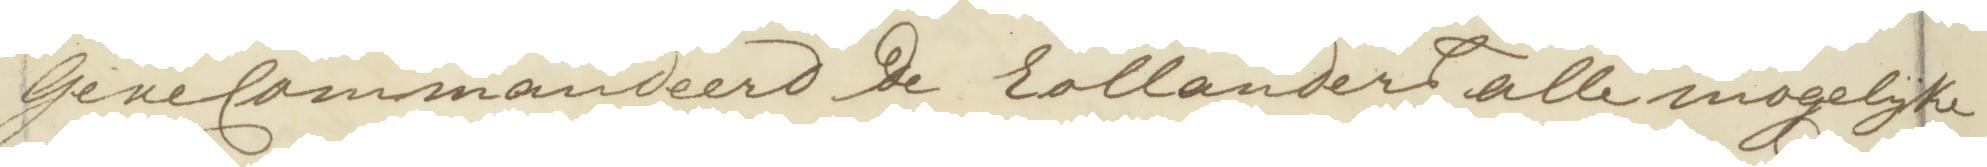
gerecommandeerd de hollanders alle mogelijke
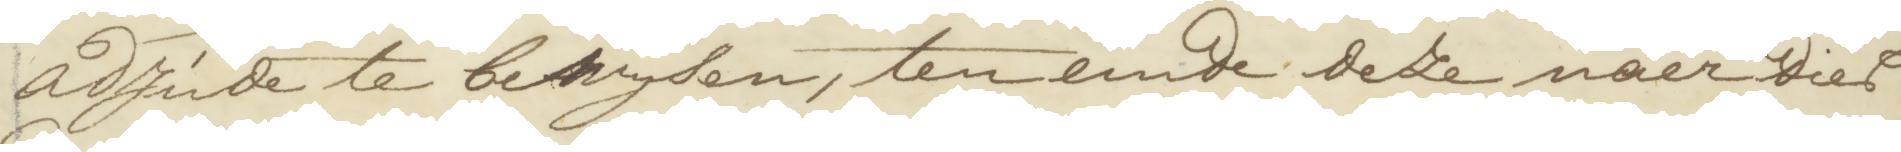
adjude te bewijsen, ten einde deze naer dies
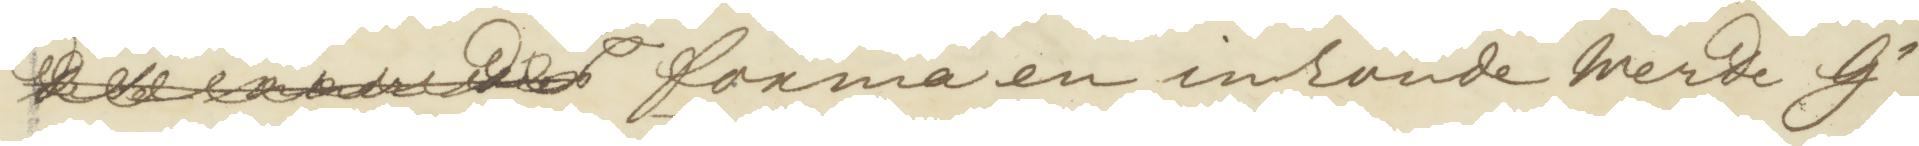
deze naar dies forma en inhoude werde g"
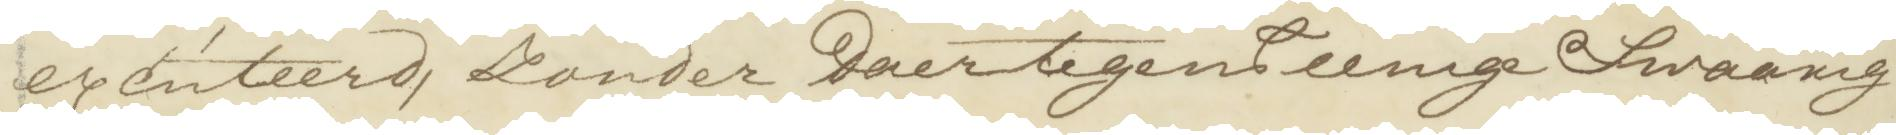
excuteerd, zonder daer tegens eenige Swaarig
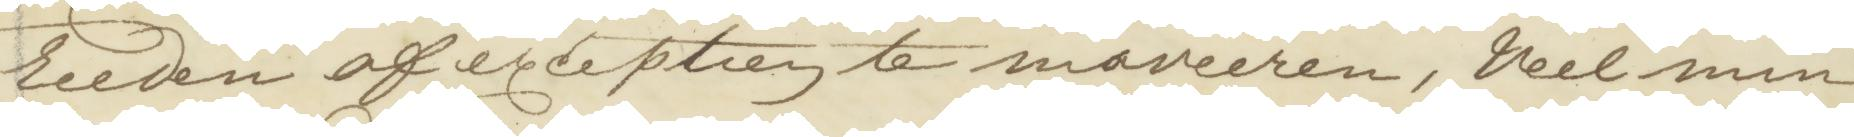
heeden of exceptien te moveeren, veel min
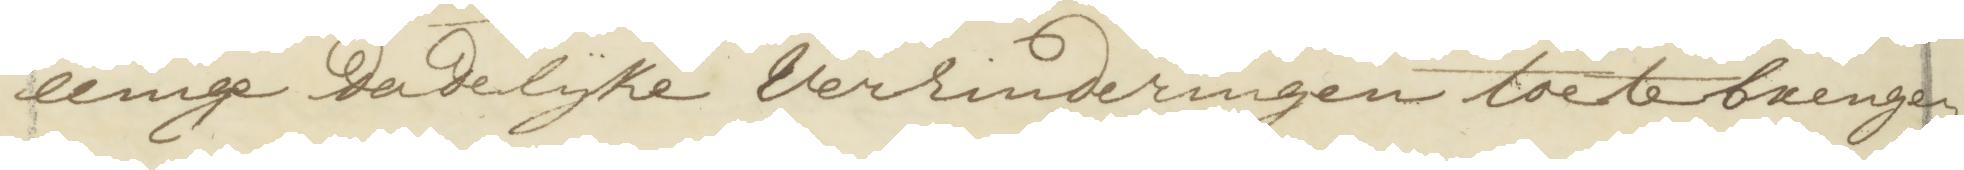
eenige dadelijke verhinderingen toe te brengen
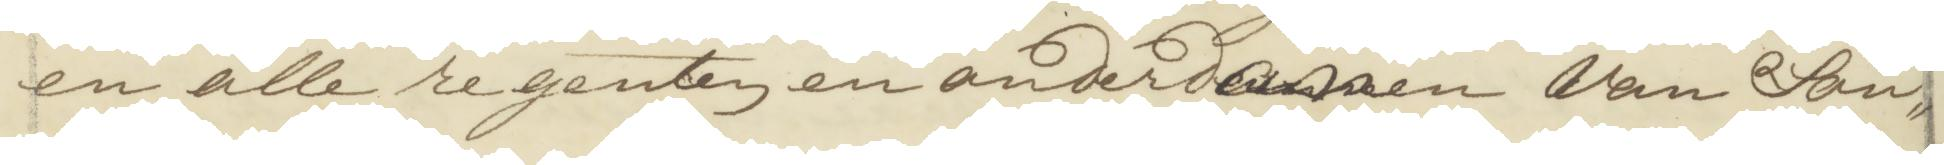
en alle regenten en onderdanen van Sou„
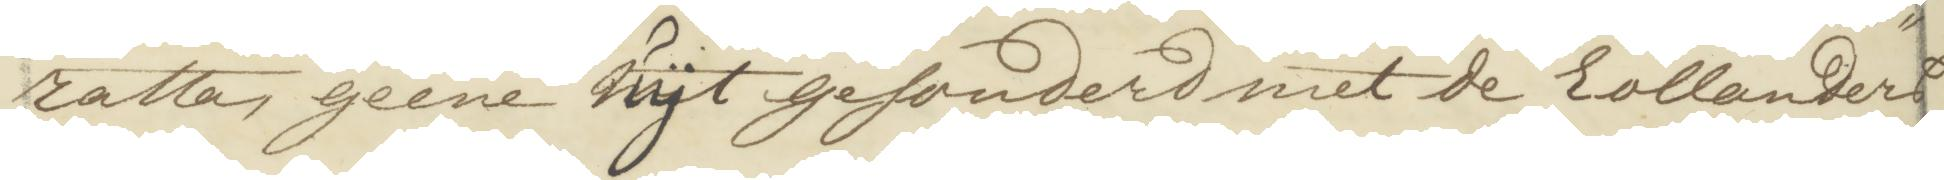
ratta geene uijt gesonderd met de hollanders
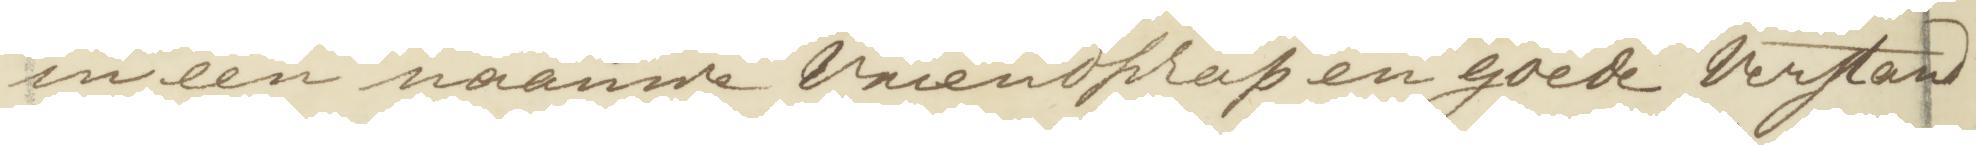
in een naauwe vriendschap en goede verstand
